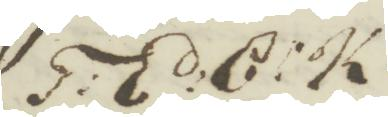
T:E:E:K
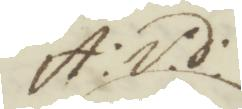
A:v:d
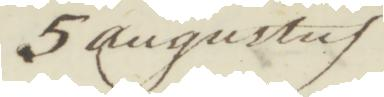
5 augustus
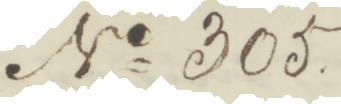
N=o 305.
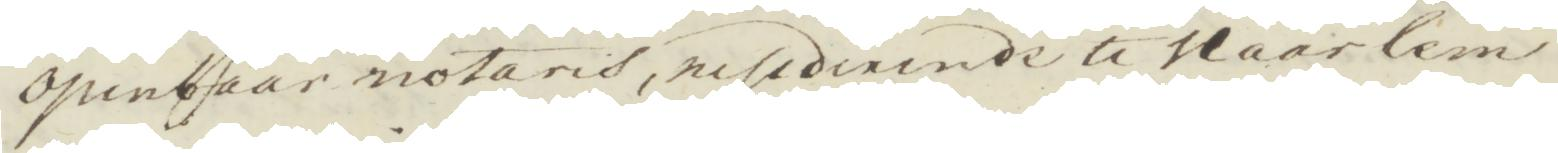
openbaar notaris, residerende te Haarlem
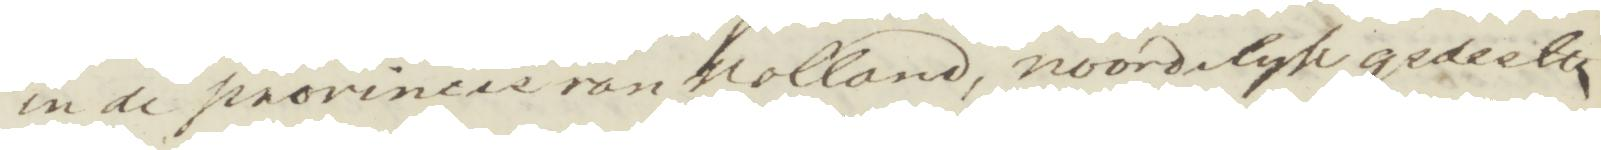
in de provincie van Holland, noordelyk gedeelte
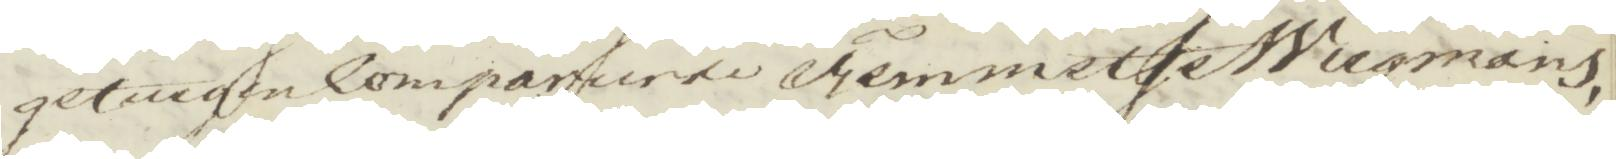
getuigen comparante Femmetje Wiegmans,
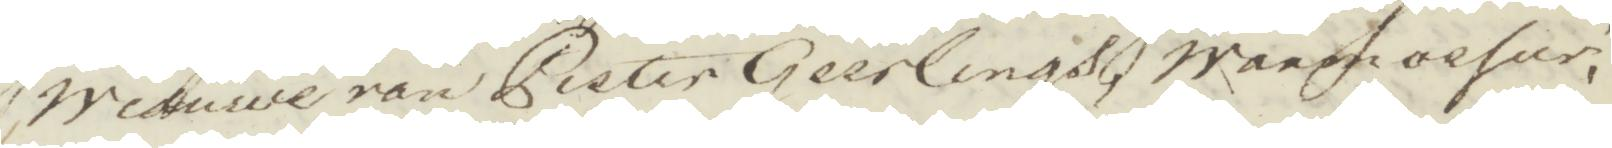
Weduwe van Pieter Geerlings, Warmoesier,
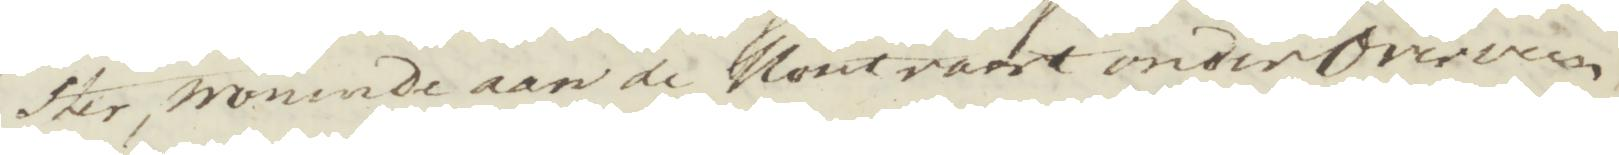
ster, wonende aan de Houtvoort onder Overveen
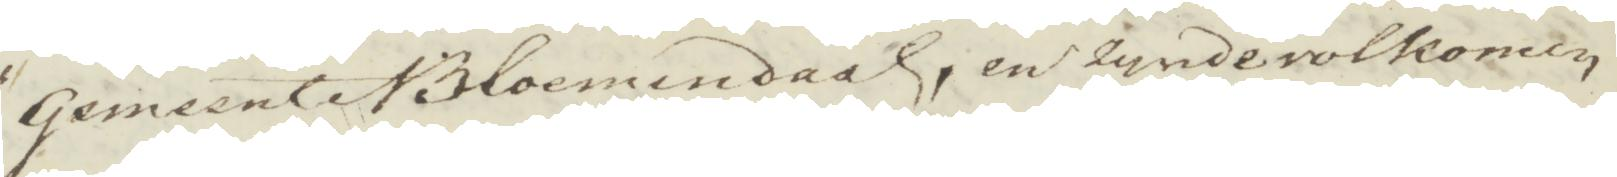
Gemeente Bloemendaal, en zynde volkomen
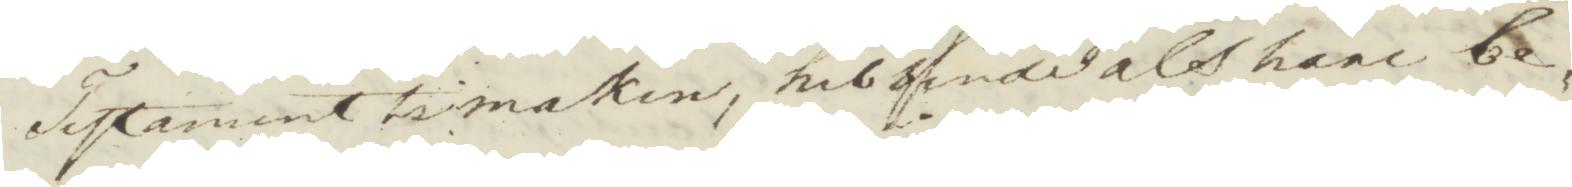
Testament te maken, hebbende als hare be
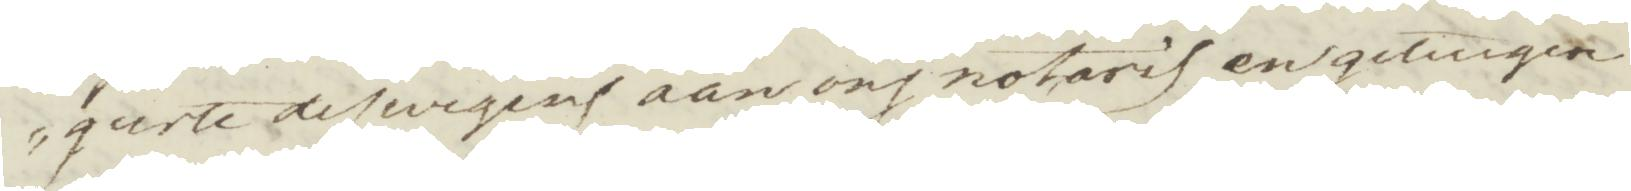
„geerte deswegens aan ons notaris en getuigen
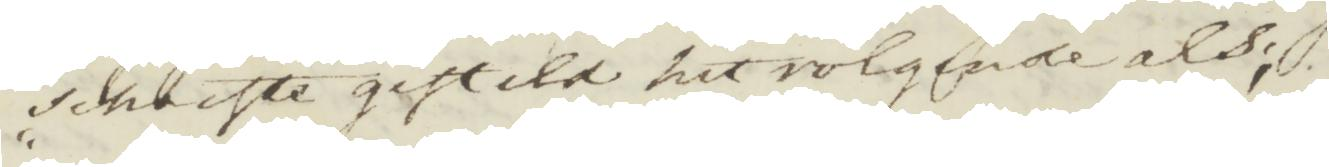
„schrifte gesteld het volgende als;
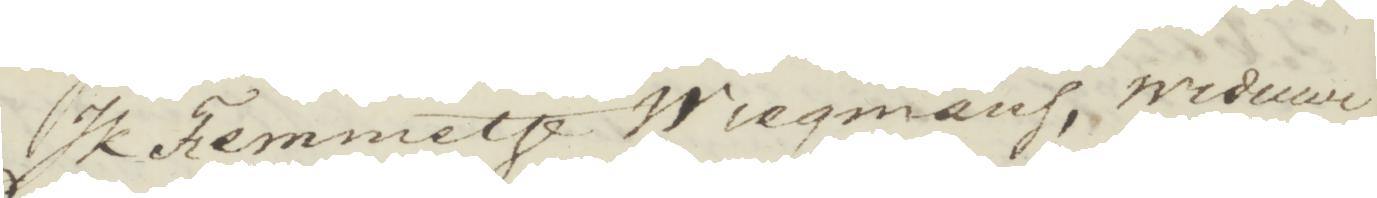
Jk Femmetje Wiegmans, weduwe
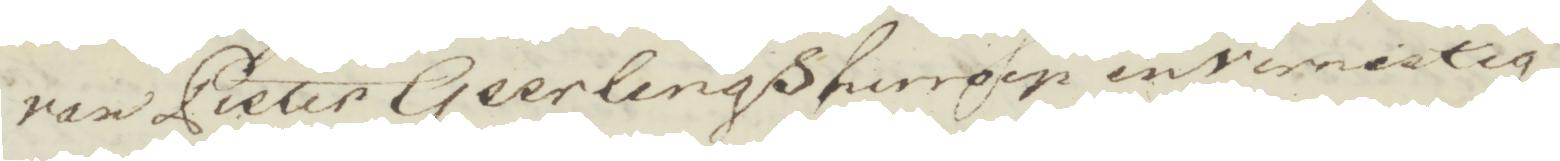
van Pieter Geerlings herroep en vernietig
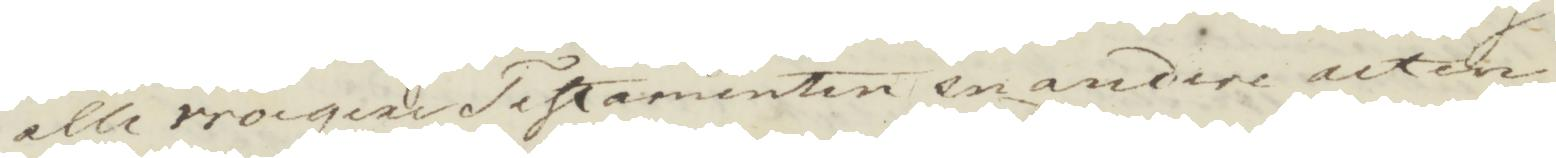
alle vroegere Testamenten en andere acten
